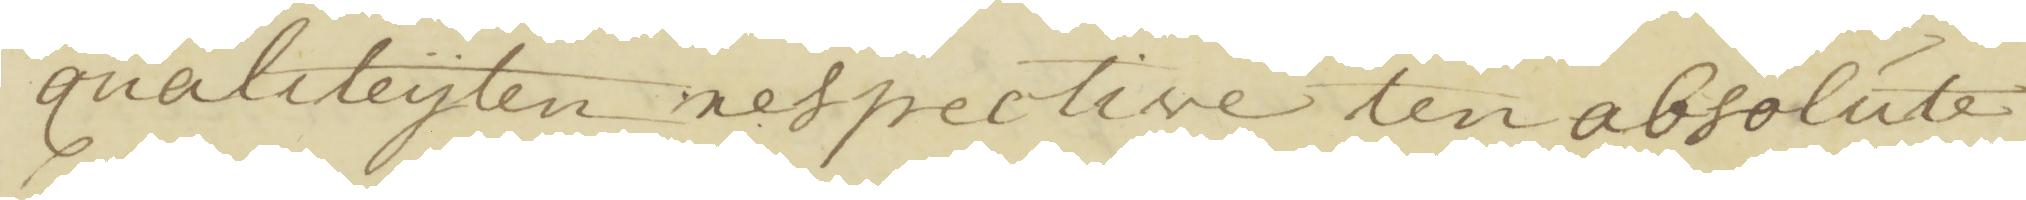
qualiteijten respective ten absolute
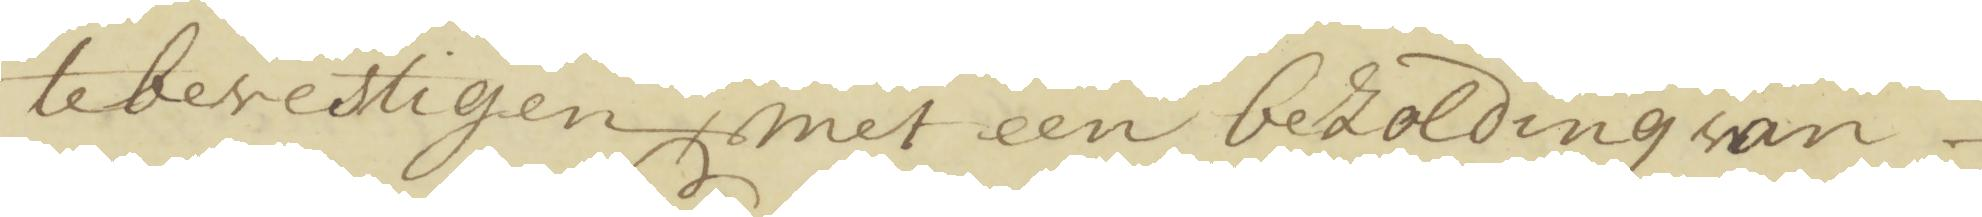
te bevestigen, met een bezolding van
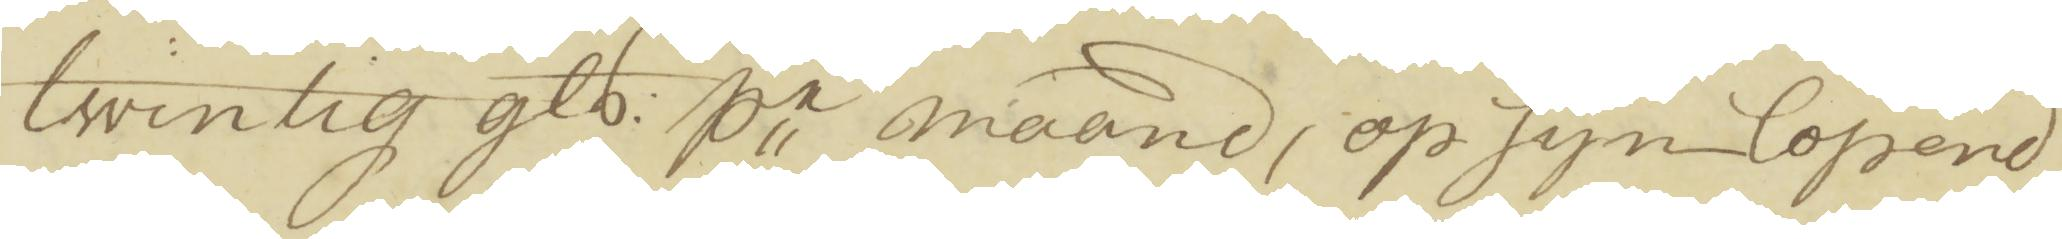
twintig gls: p„r maand, op sijn lopend
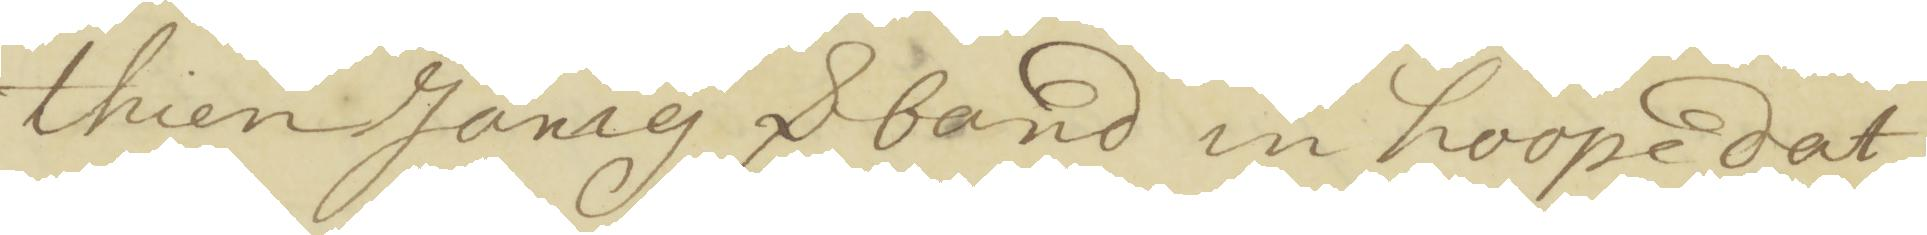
thien Jarig verband in hoope dat
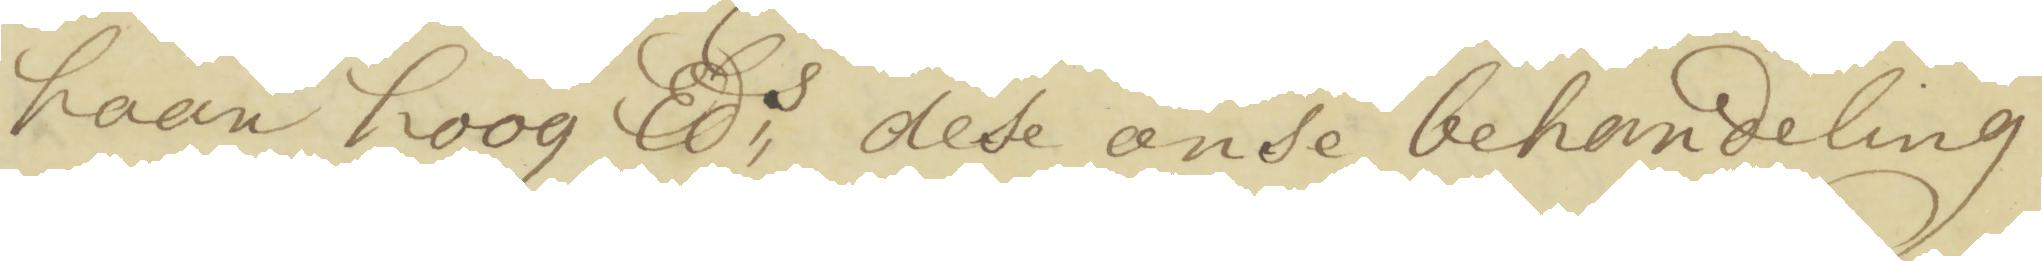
haar hoog Ed„s dese onse behandeling
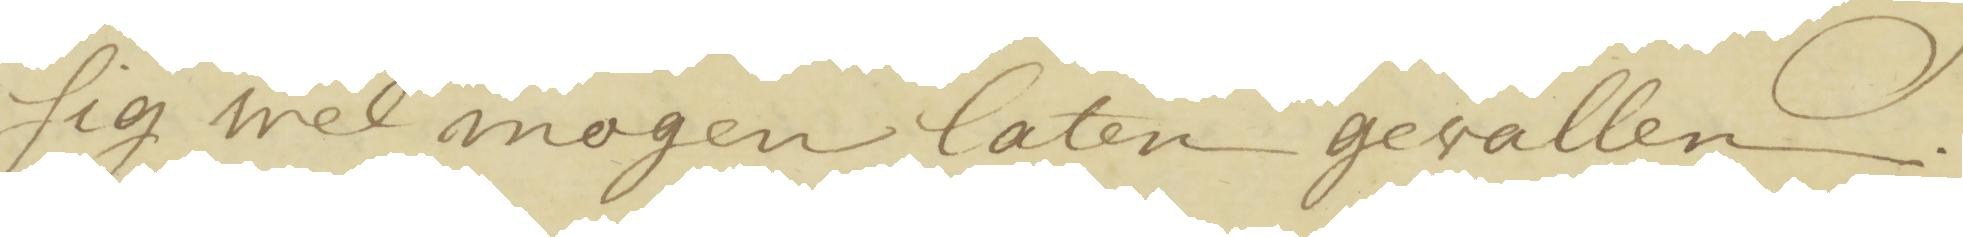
Sig wel mogen laten gevallen.
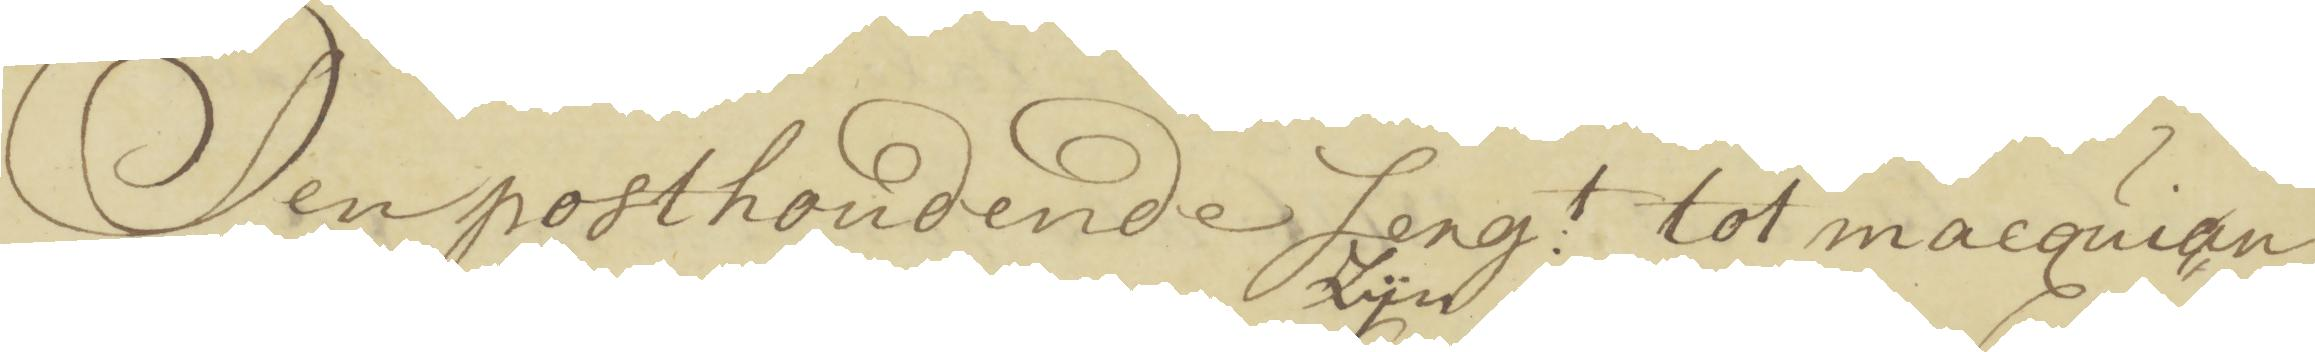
Den post houdende Serg:t tot macquian
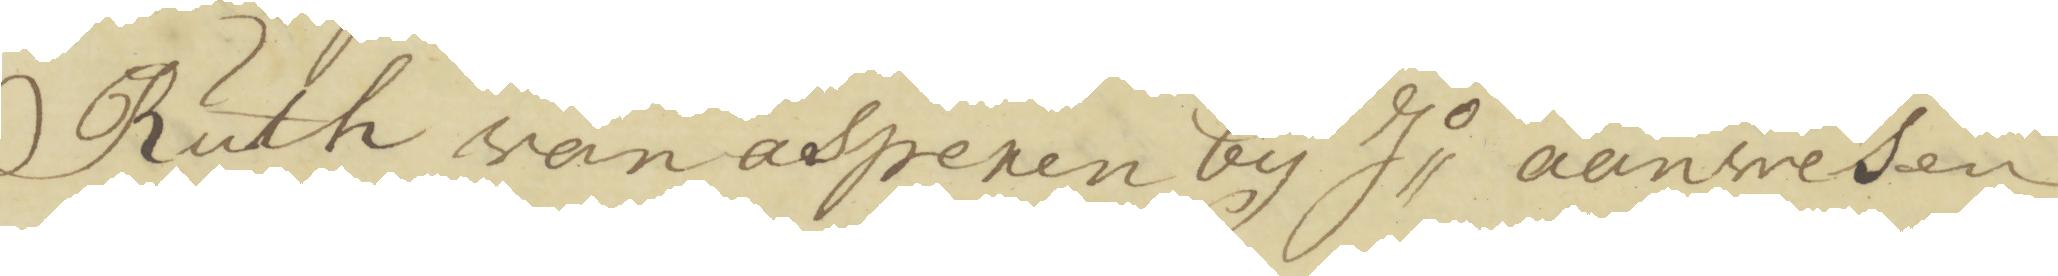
Ruth van asperen bij J„o aanwesen
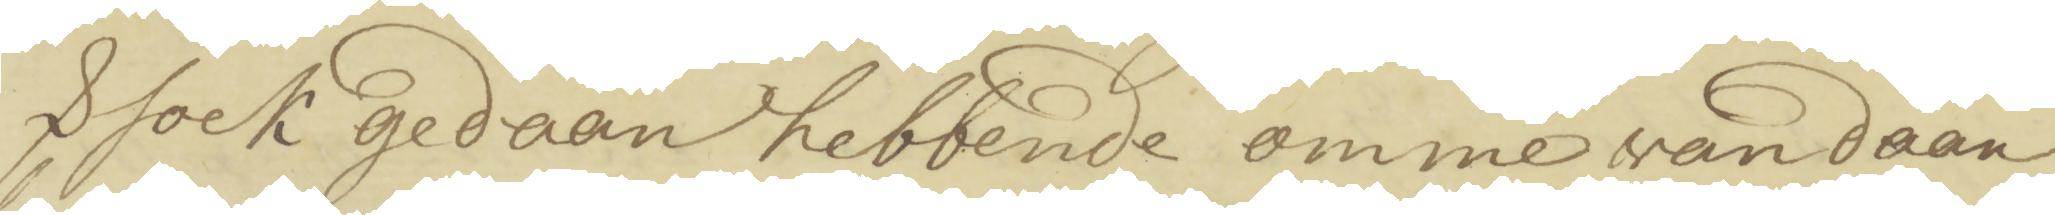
versoek gedaan hebbende omme van daar
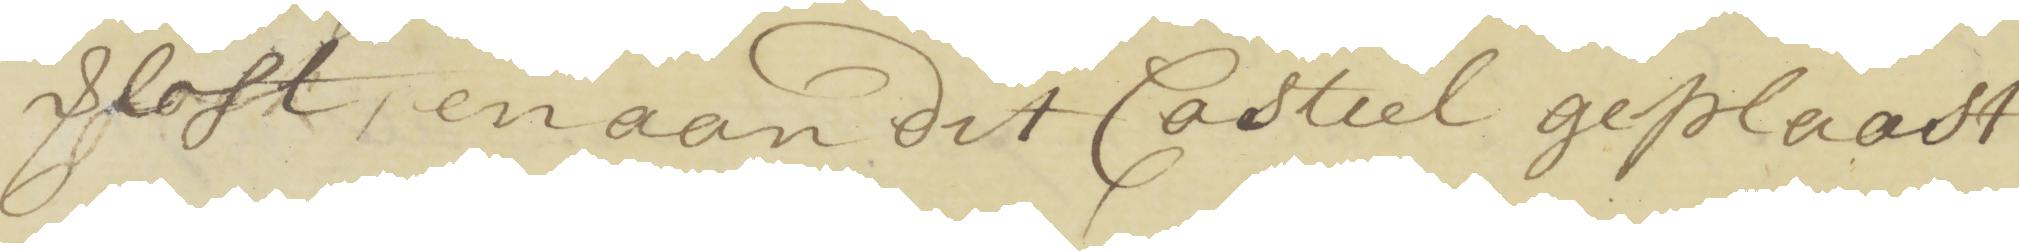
verlost, en aan dit Casteel geplaast
